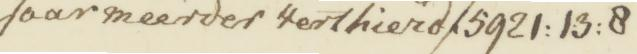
Jaar meerder verthierd ƒ5921:13:8
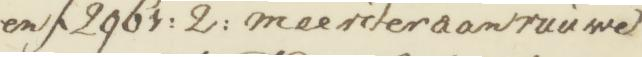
en ƒ2961:2: meerder aan ruuwe
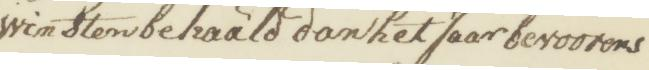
winsten behaald dan het Jaar bevoorens
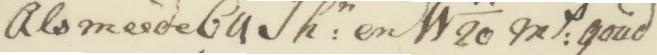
als mede 64 Th:r en 11 17/20 m:s goud
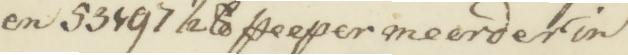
en 53197½ lb peeper meerder in
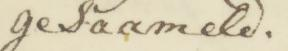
gesaameld.
